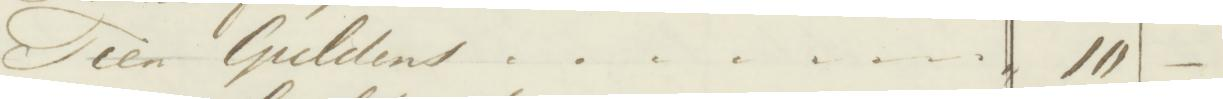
Tien Guldens . . . . . . . . „ 10 —
